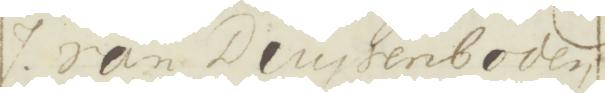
J. van Duyvenboden
